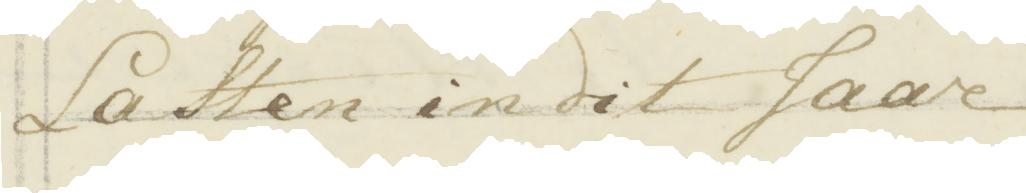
Lasten in dit Jaar
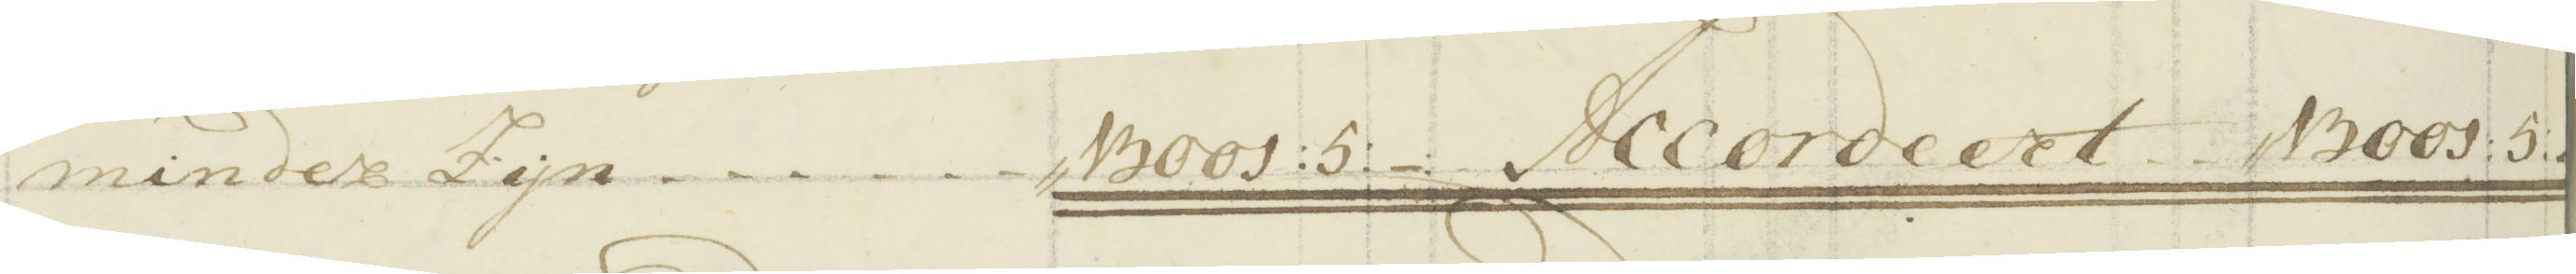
minder zijn - - - - - -„ 13001:5:—: Accordeert . .„ 13001:5:.
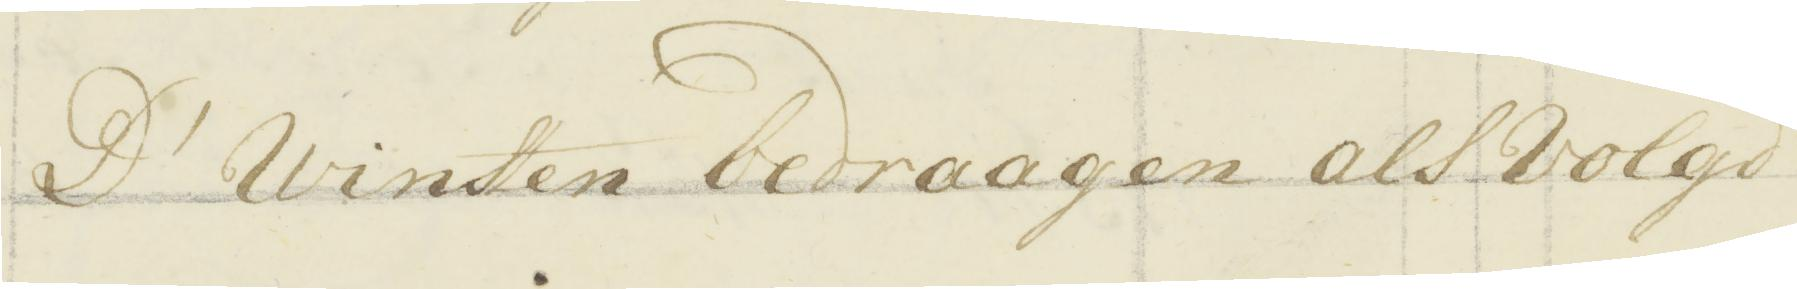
D' winsten bedraagen als volgd
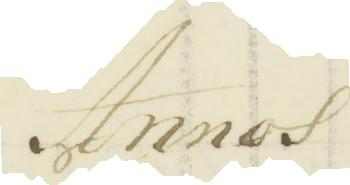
Annos
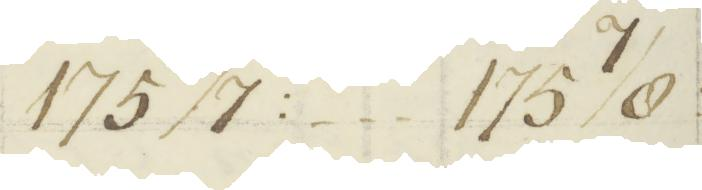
175 6/7: - - - 175 7/8:
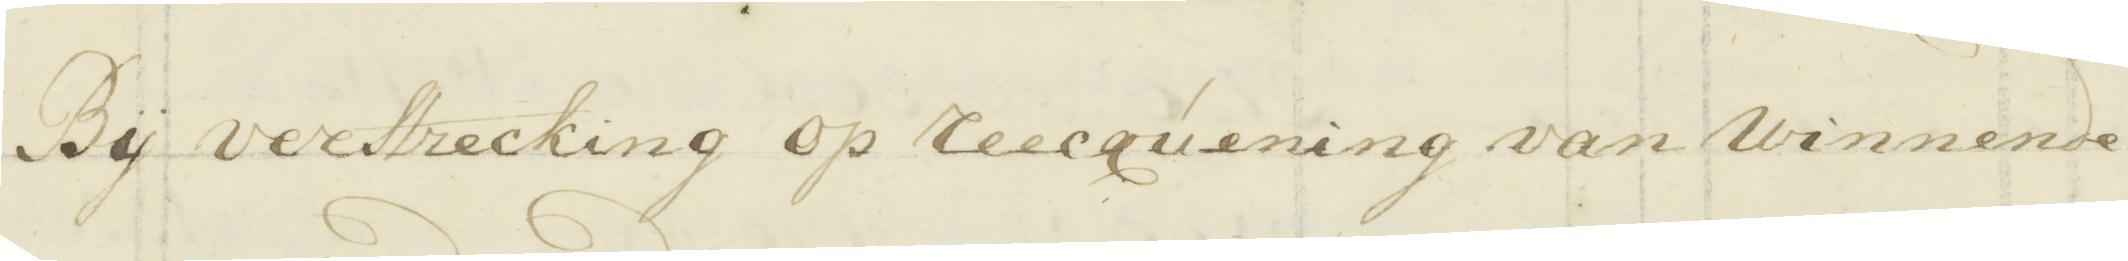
Bij verstrecking op reecquening van winnende
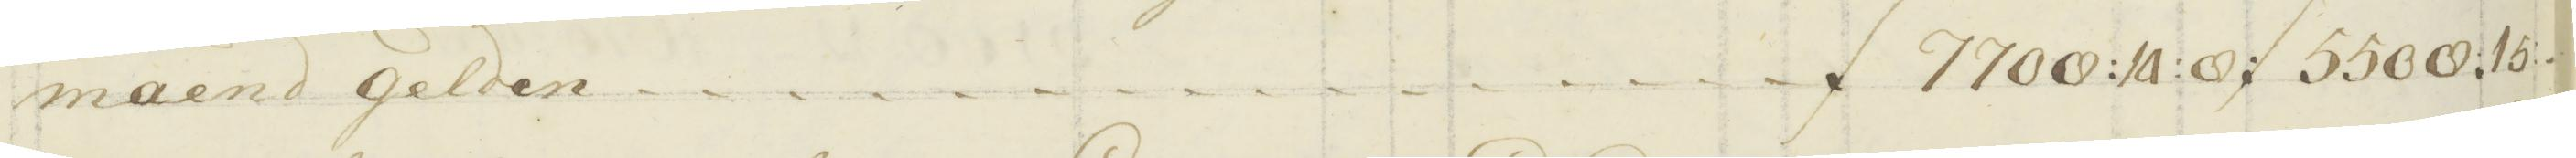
maend gelden - - - - - - - - - - - - - - - - ƒ 7708:14:8 ƒ 5508:15:-
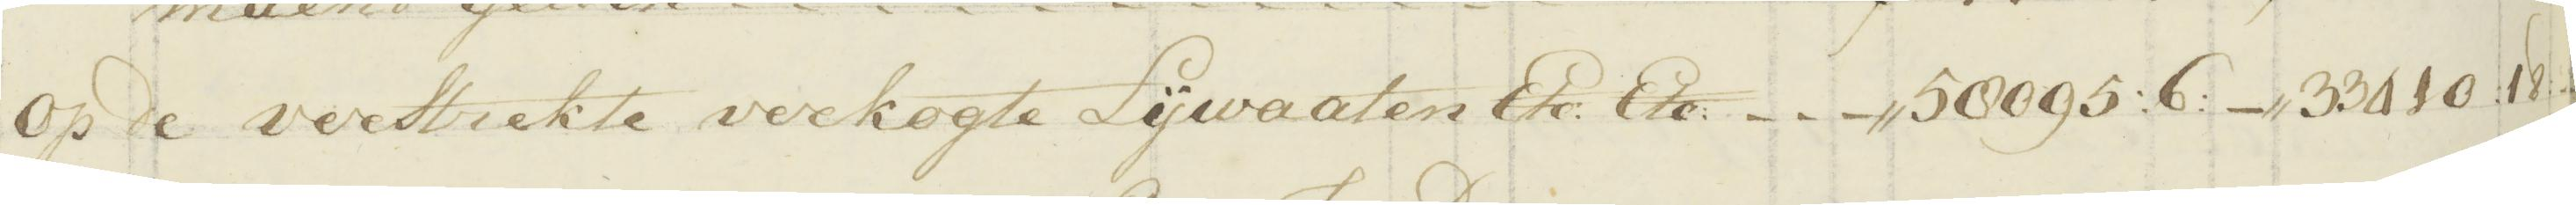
Op de verstrekte verkogte Lijwaaten Etc: Etc: _ _ _ „58095:6: —„ 33410:18:—
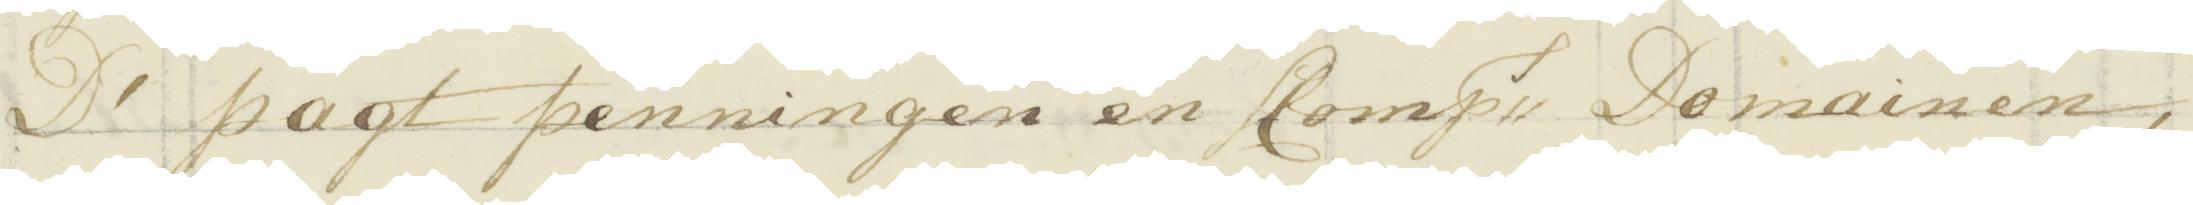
D' pagt penningen en sComp„s Domainen,
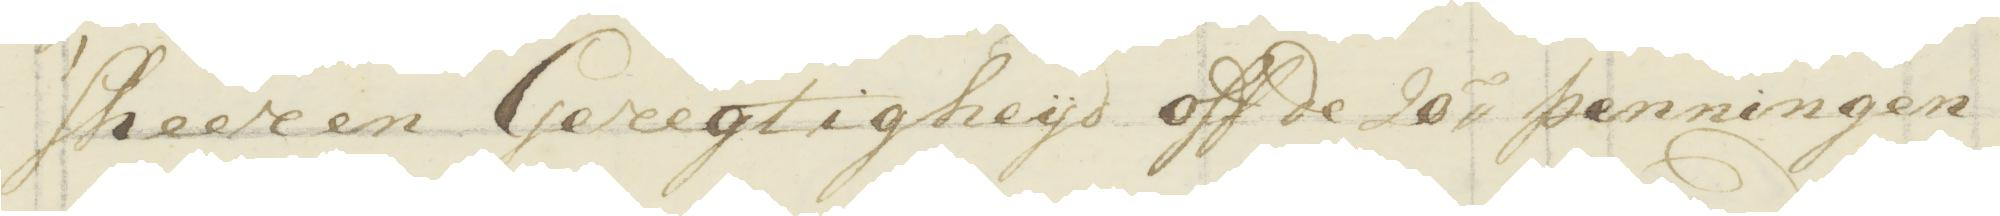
'sheeren Geregtigheijd off de 20„~ penningen
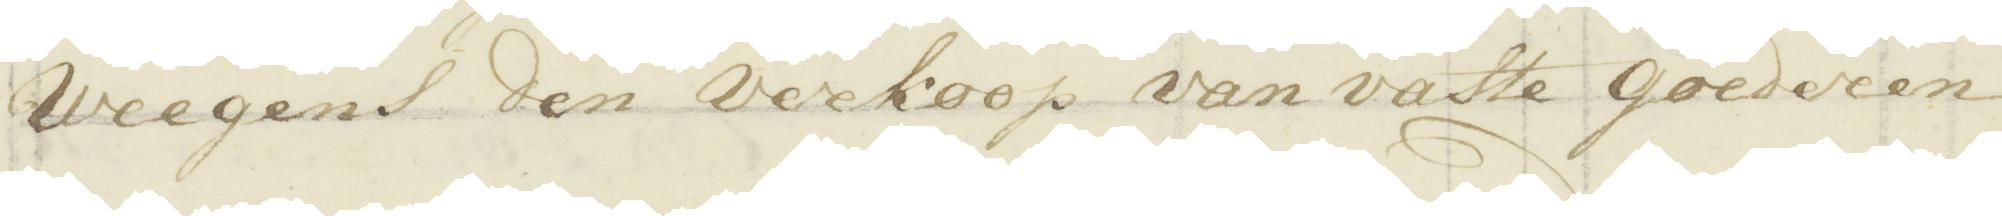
weegens den verkoop van vaste goederen
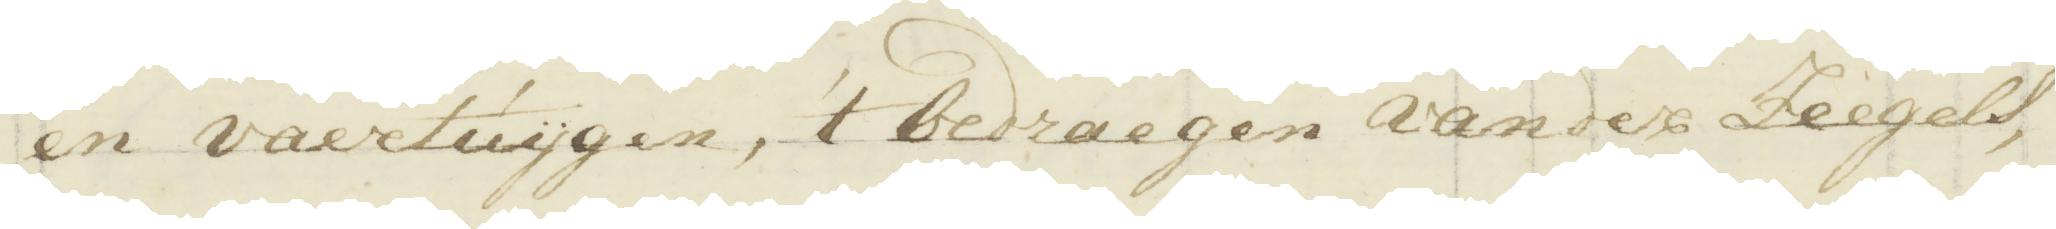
en vaertuijgen, ’t bedraegen van der Zeegels,
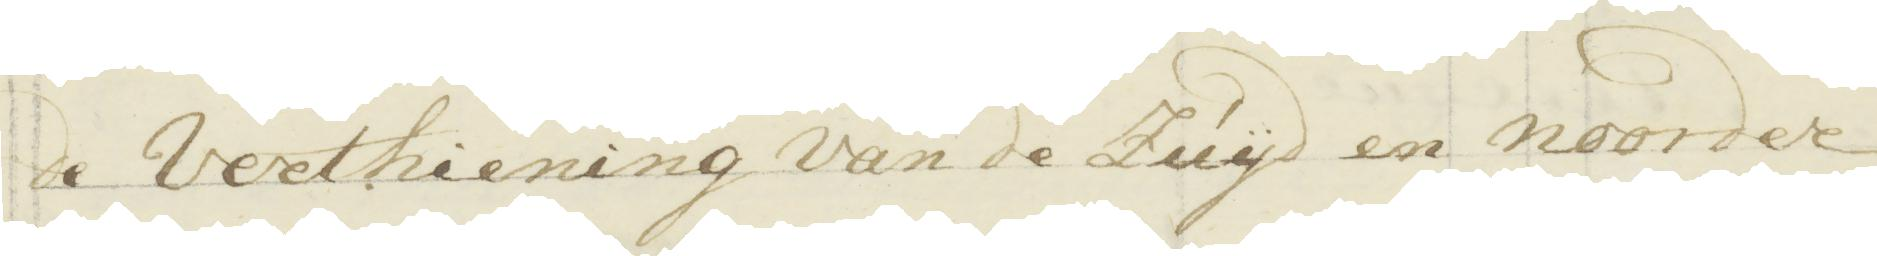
de verthiening van de zuijd en noorder
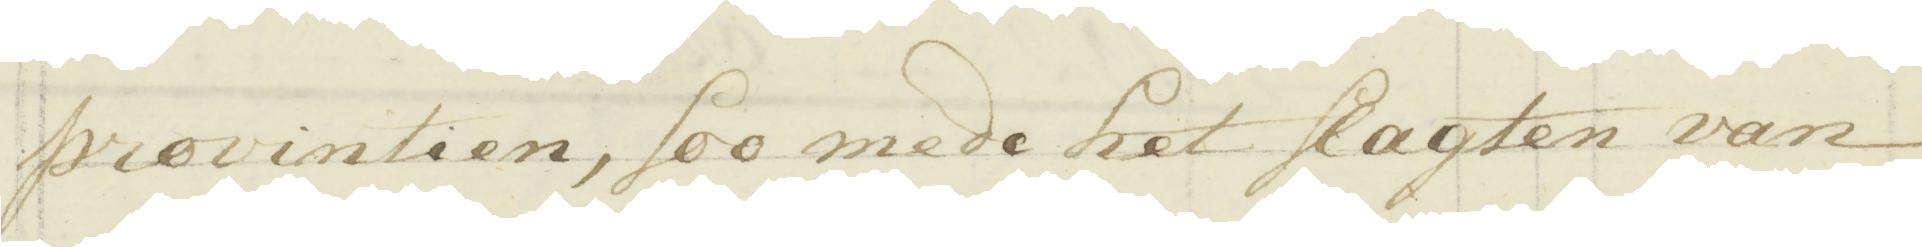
provintien, soo mede het slagten van
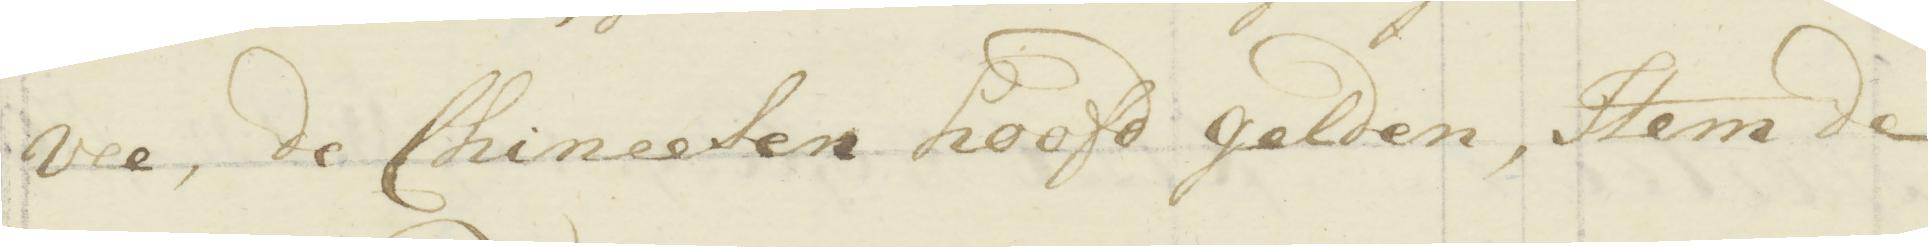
vee, de Chineesen hoofd gelden, Item de
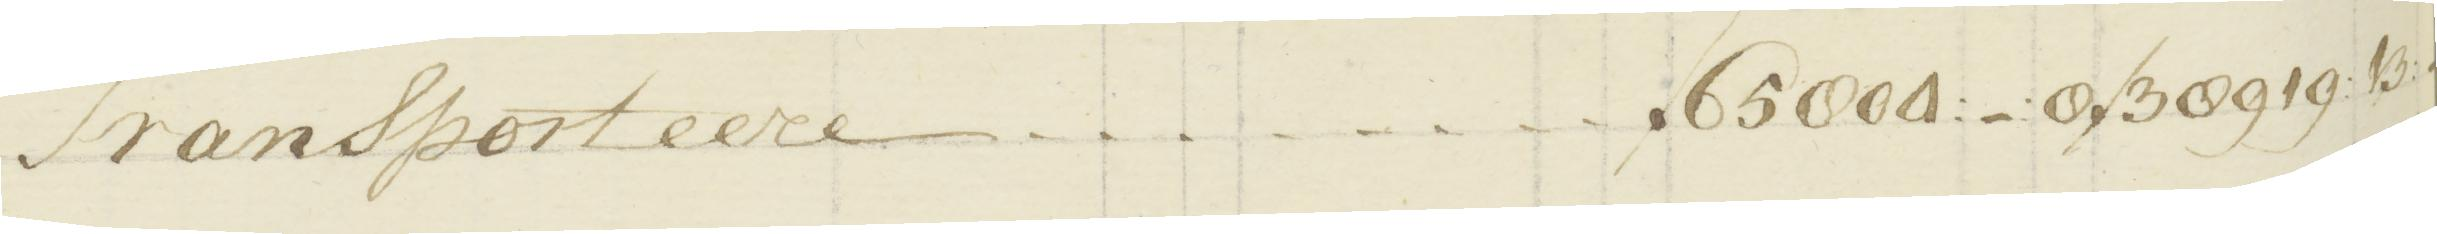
Transporteere - . . - - - - - ƒ65804:—:8 ƒ38919:13:
